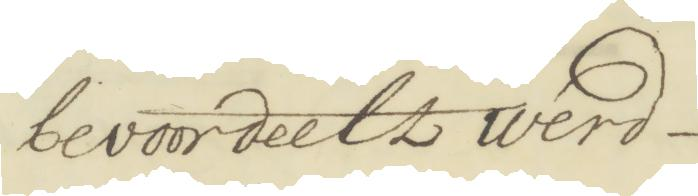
bevoordeelt werd —
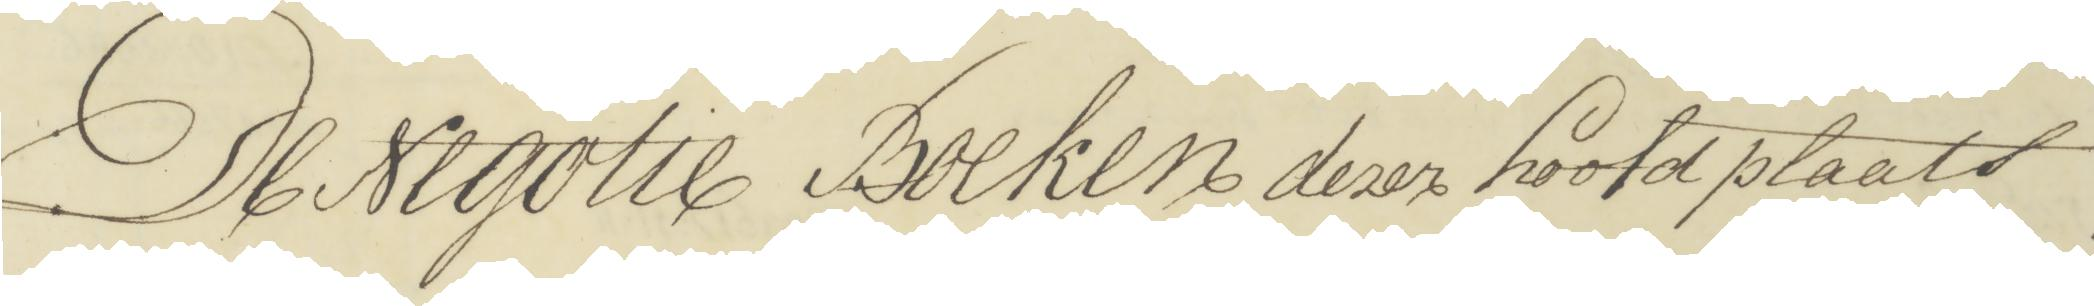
De Negotie Boeken dezer hoofd plaats
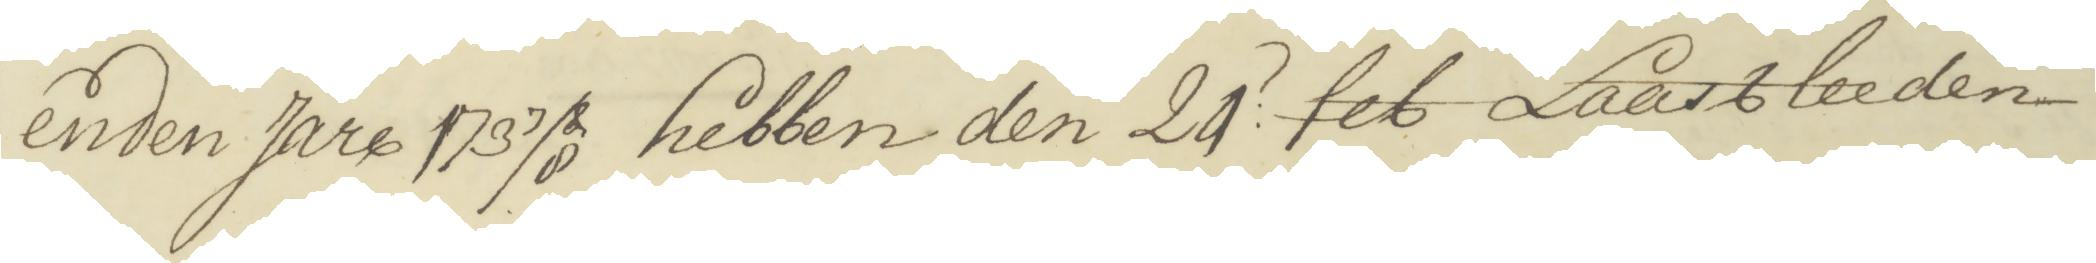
enden Jare 1737/8 hebben den 24:en feb Laastleeden
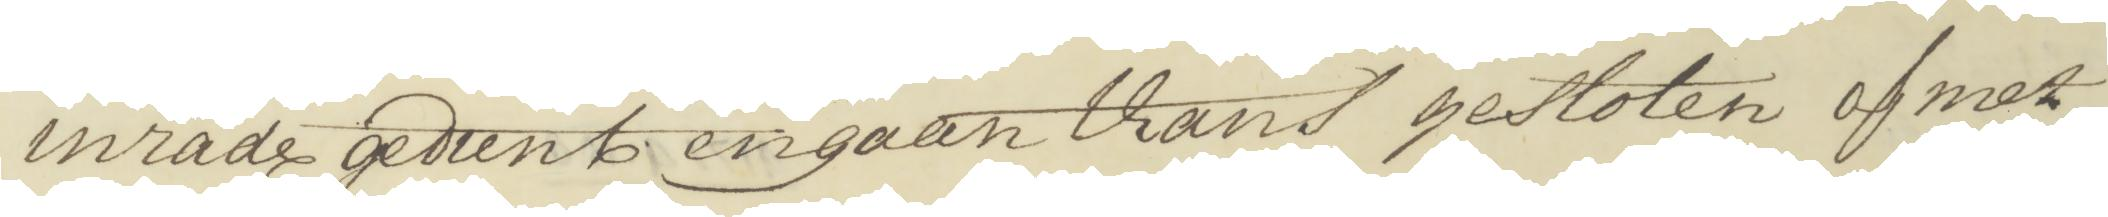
inrade gedient en gaan thans gesloten over met
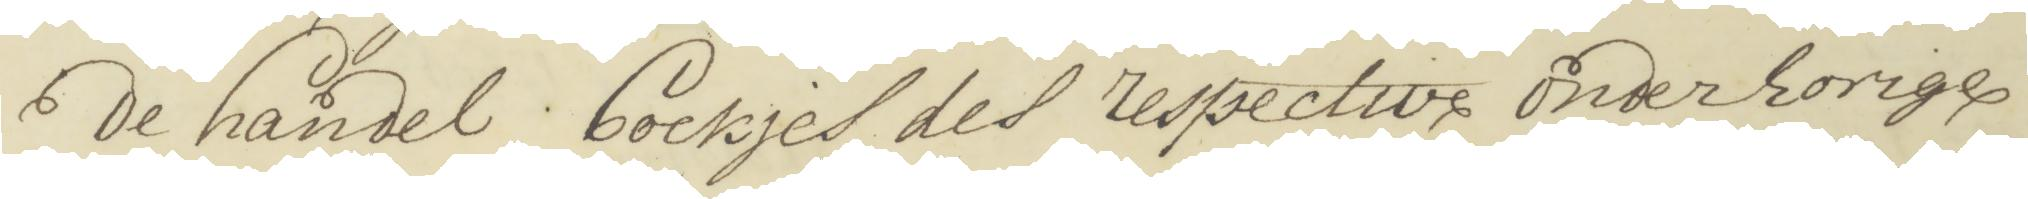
de handel boekjes des respective onderhorige
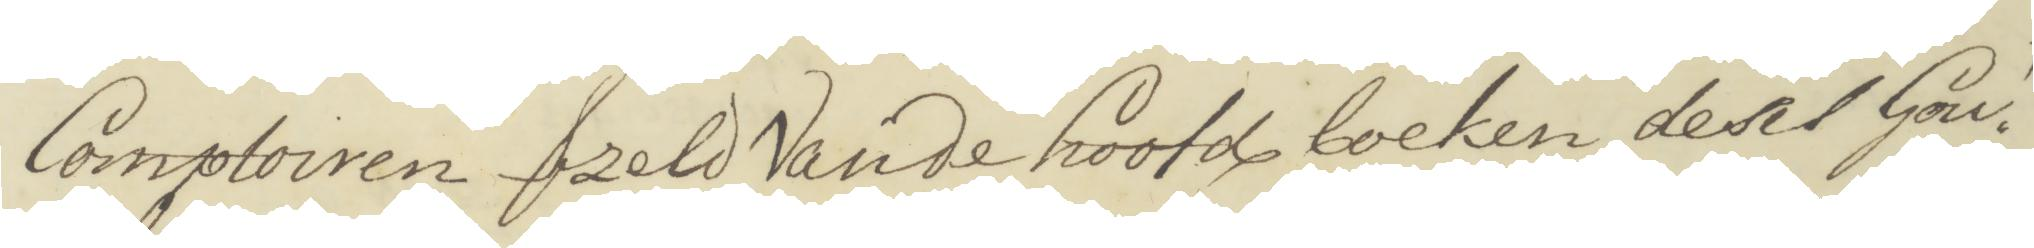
Comptoiren verzeld vande hoofd boeken deses Gou„
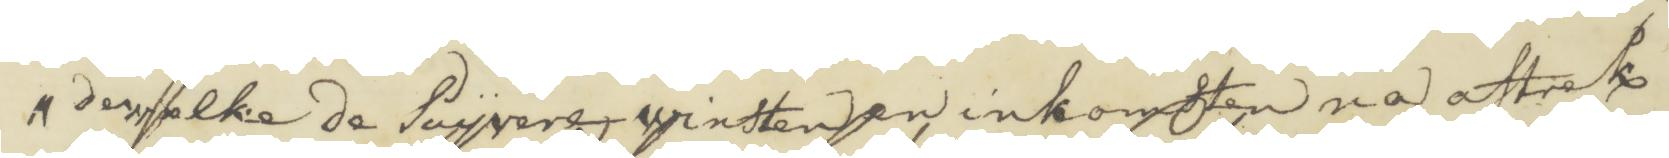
^dewelke de suijvere winsten en inkomsten na aftrek
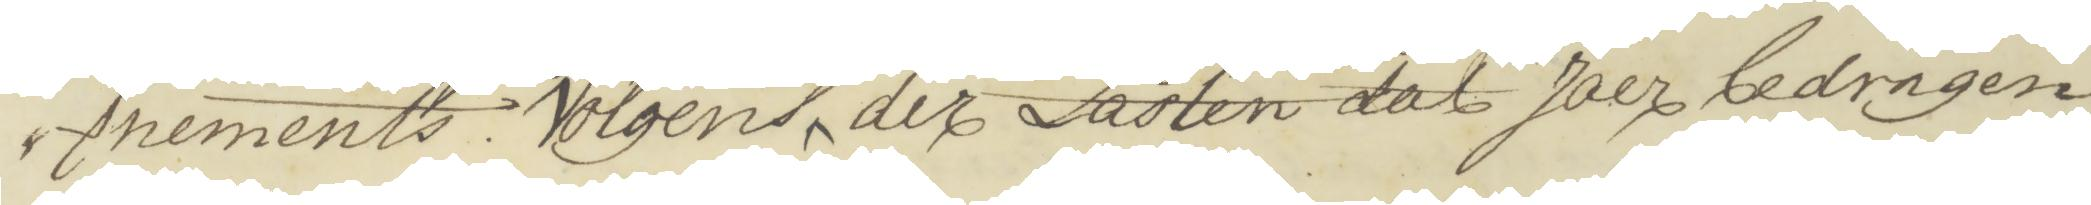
„vernements. Volgens ^ der Lasten dat Jaer bedragen
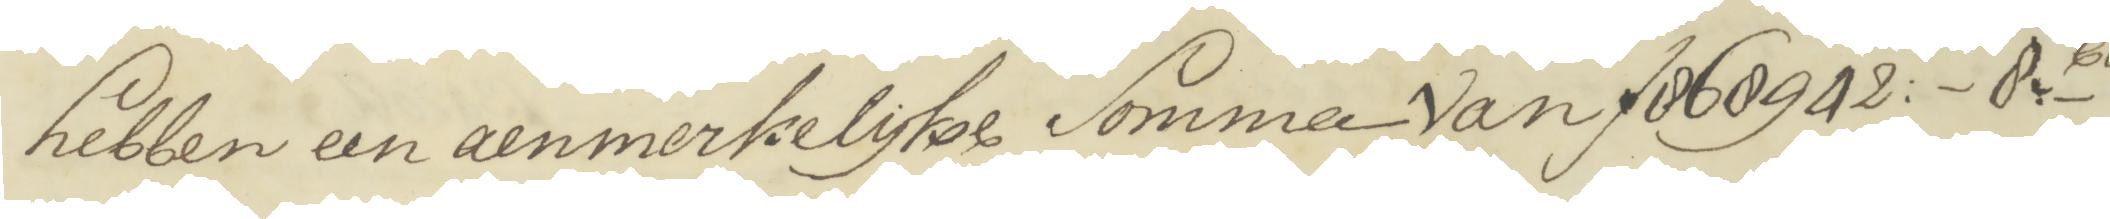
hebben een aenmerkelijke somma van ƒ868942: — 8: —
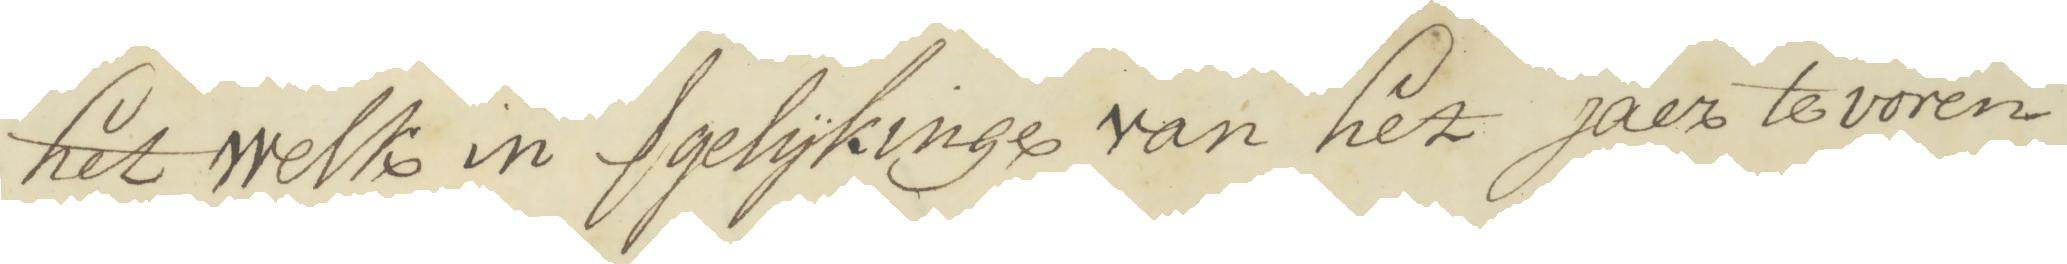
het welk in vergelijkinge van het jaer te voren
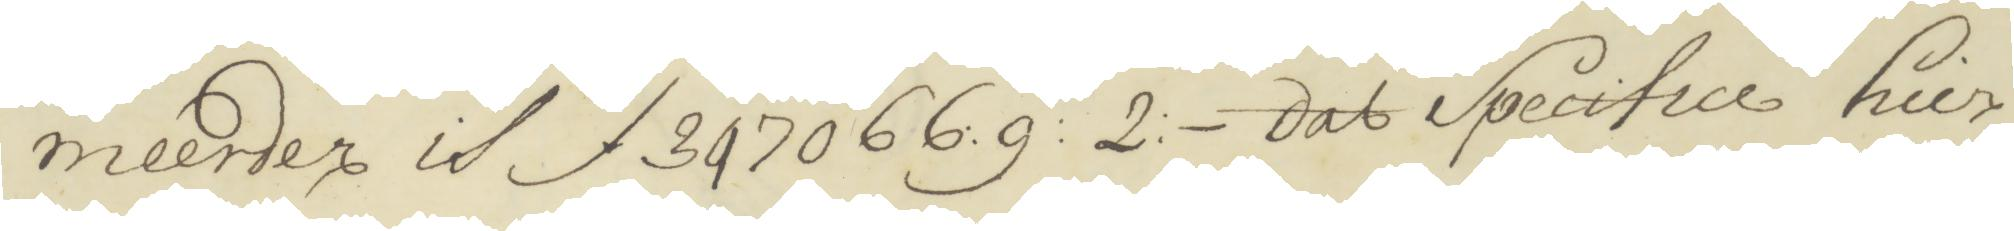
meerder is ƒ 347066: 9: 2: — dat specifice hier
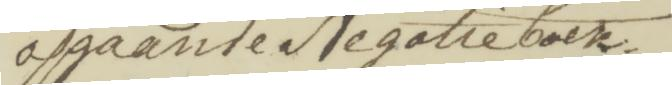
overgaande Negotie boek
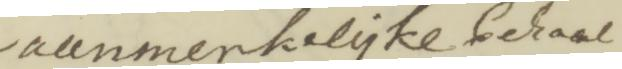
aanmerkelijke behaal
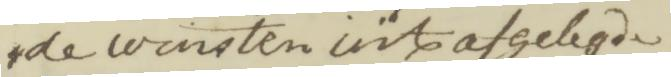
„de winsten in't afgelegde
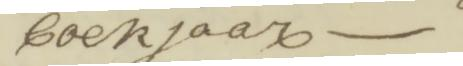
boekjaar —
